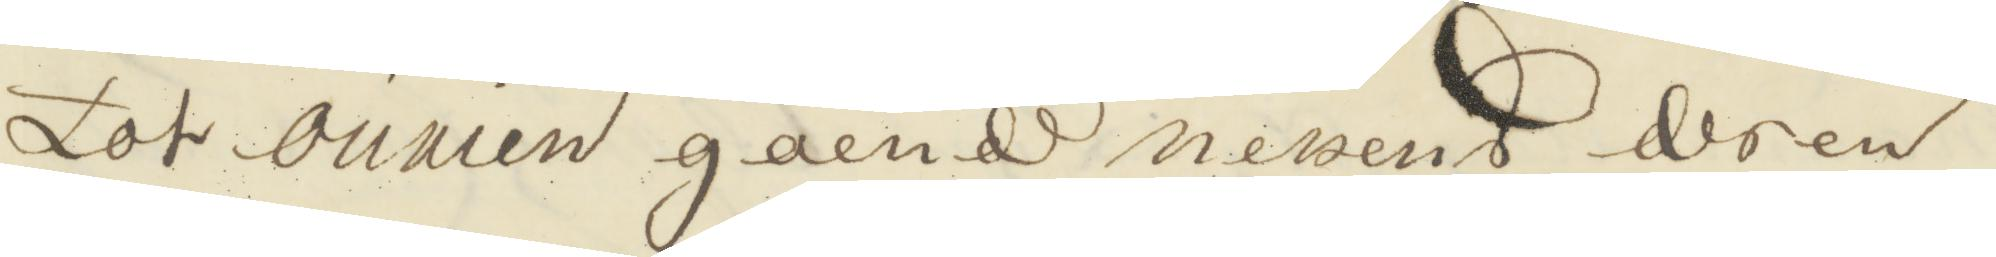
tot ourien gaende nevens desen
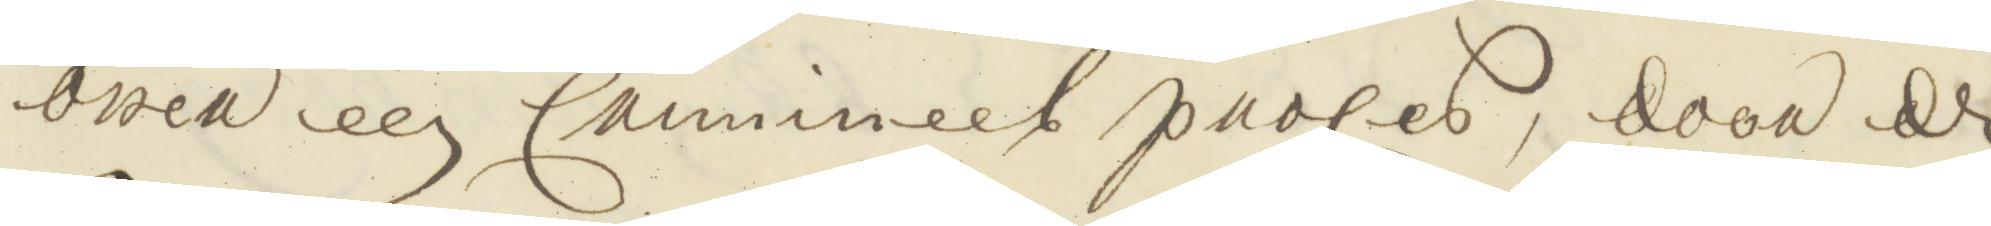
over een crimineel proces, door den
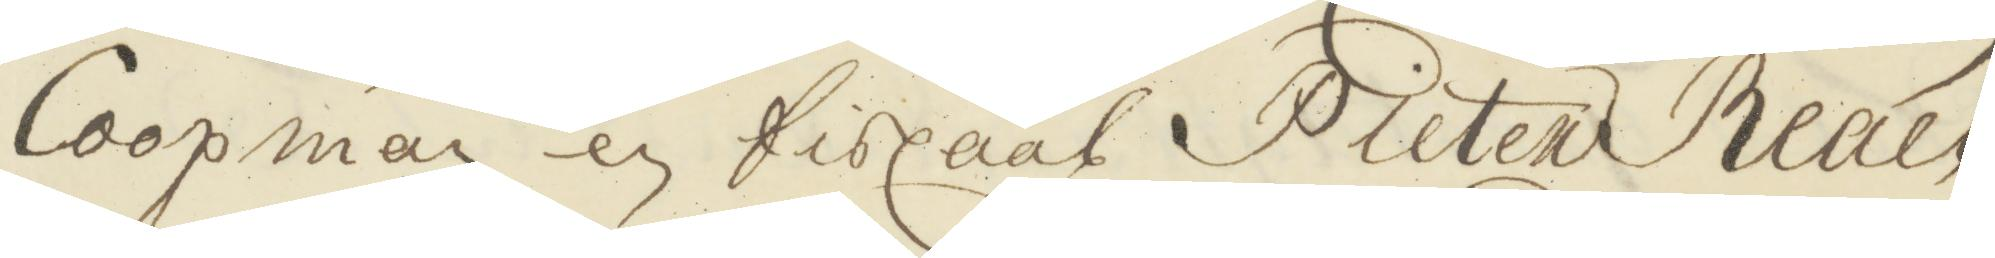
Coopman en fiscaal Pieter Reael
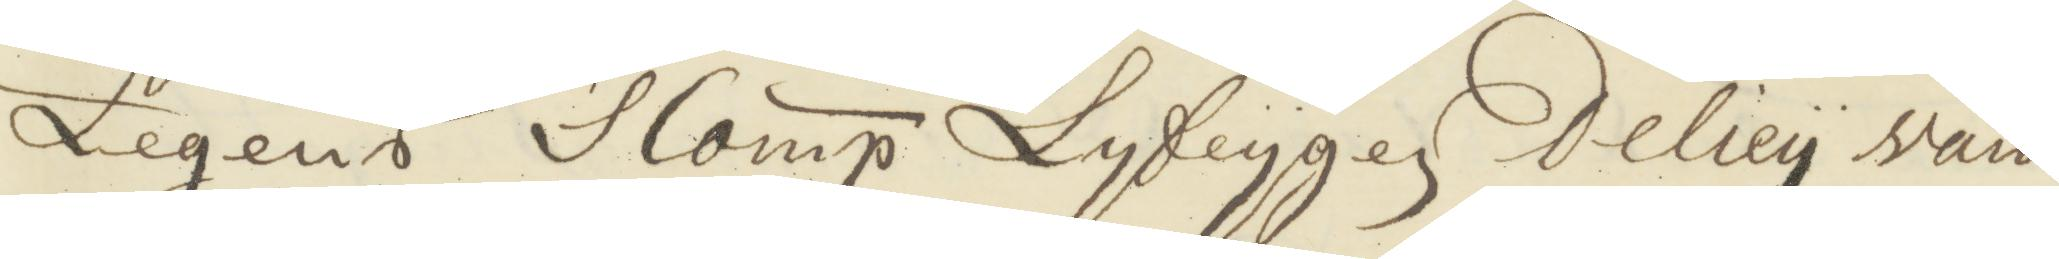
tegend ’s Comp: Lijfeijgen delieij van
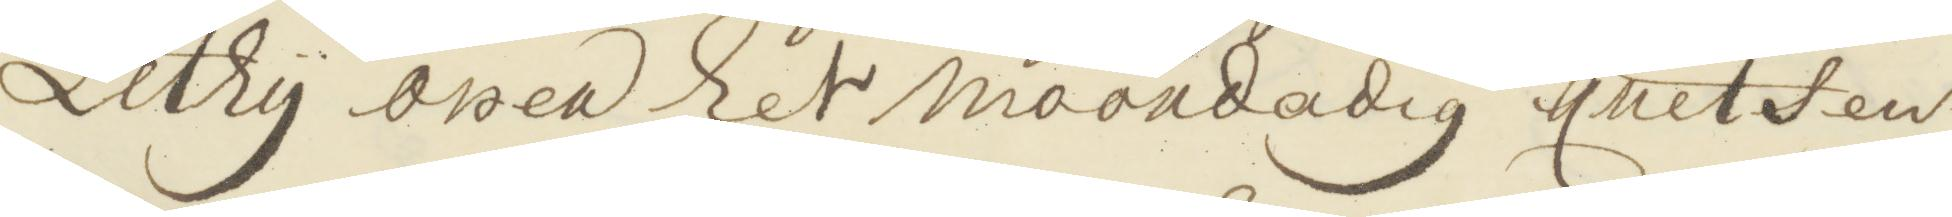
Lethij over het moordadig quetsen
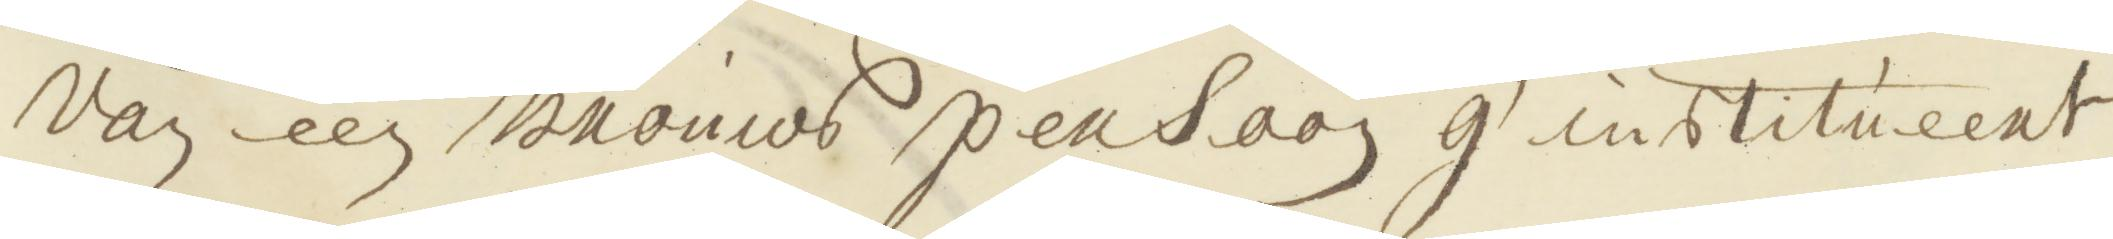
van een vrouws persoon g’institueert
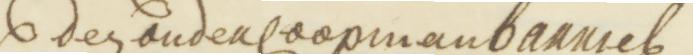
den ondercoopman barriel
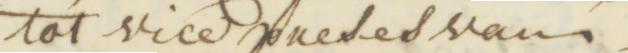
tot vice preses van
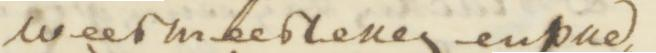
weesmeesteren en pre
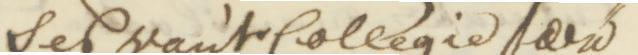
ses van’t Collegie der
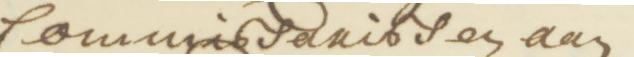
Commisarissen aan
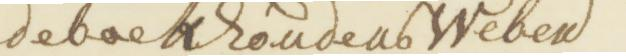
de boekhouders Weber
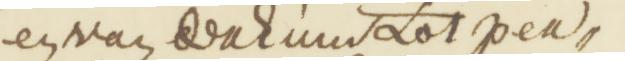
en van derhum tot per„
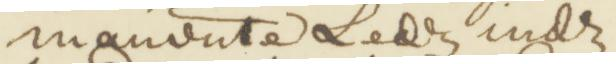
manente leden inden
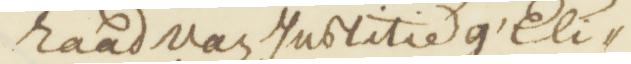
raad van Justitie g’Eli„
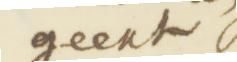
geert
